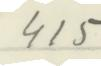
415
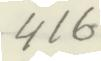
416
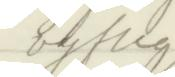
vyftlg
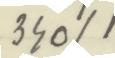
340/1
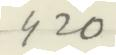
420
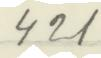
421
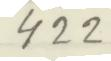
422
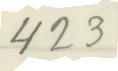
423
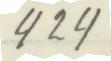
424
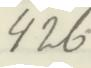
426
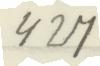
427
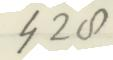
428
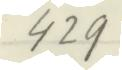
429
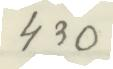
430
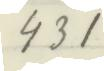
431
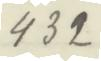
432
